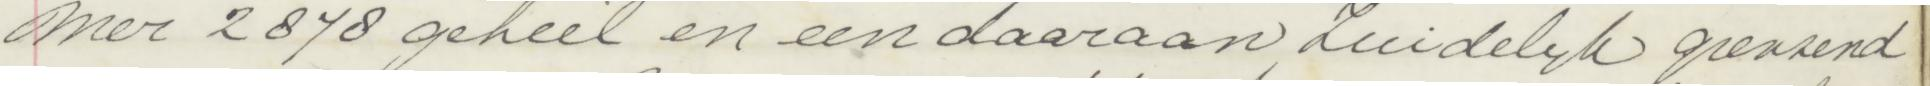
mer 2878 geheel en een daaraan Zuidelyk grenzend
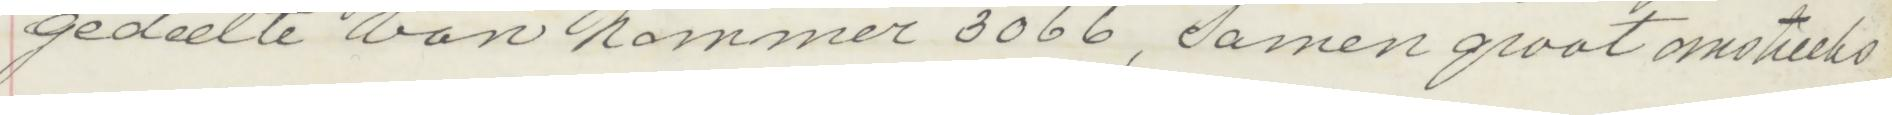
gedeelte van Nommer 3066, samen groot omstreeks
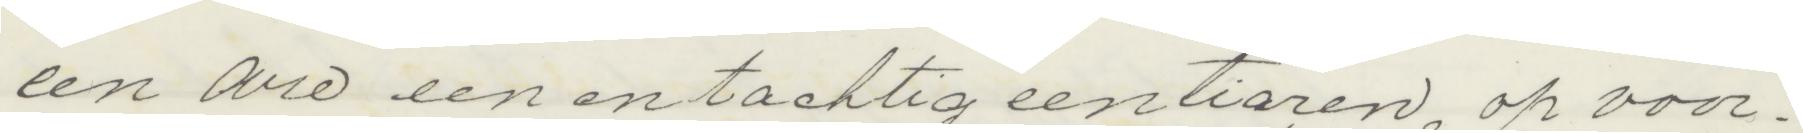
een Are een en tachtig centiaren, op voor-
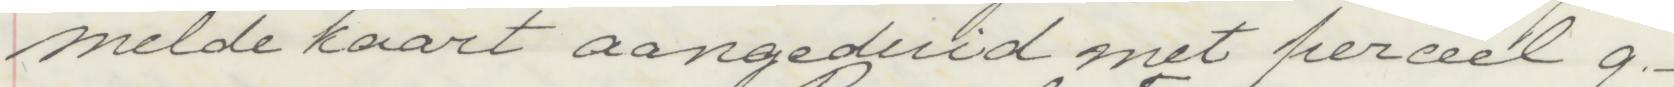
melde kaart aangeduid met perceel 9.
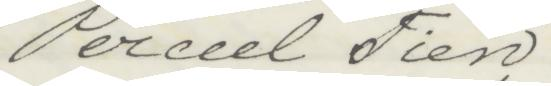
Perceel Tien
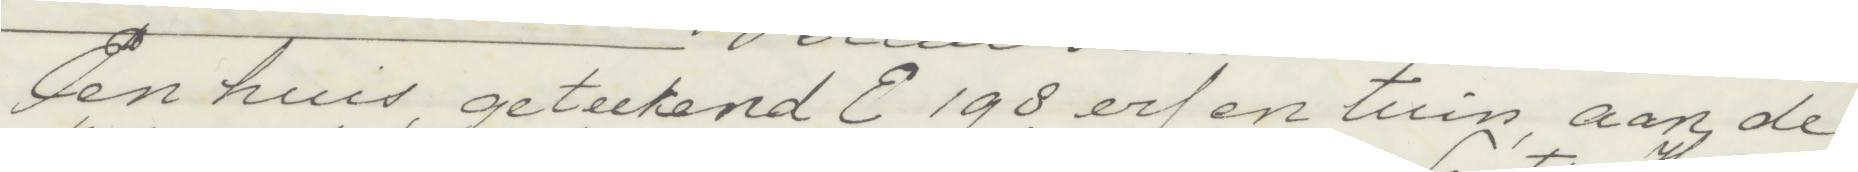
Een huis geteekend E 198, erf en tuin, aan de
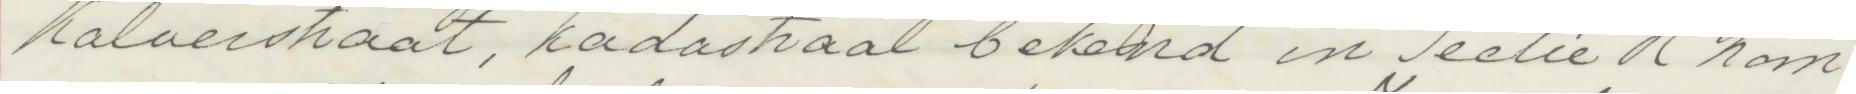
Kalverstaat, kadastraal bekend in sectie H nom
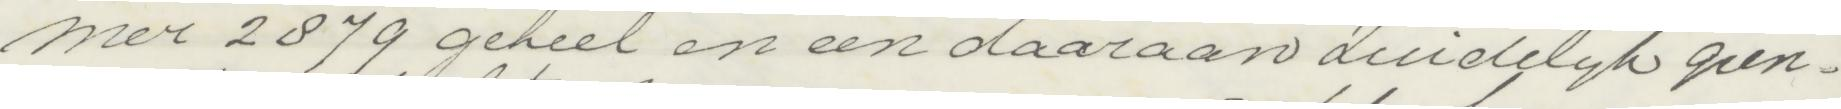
mer 2879 geheel en een daaraan Zuidelyk gren-
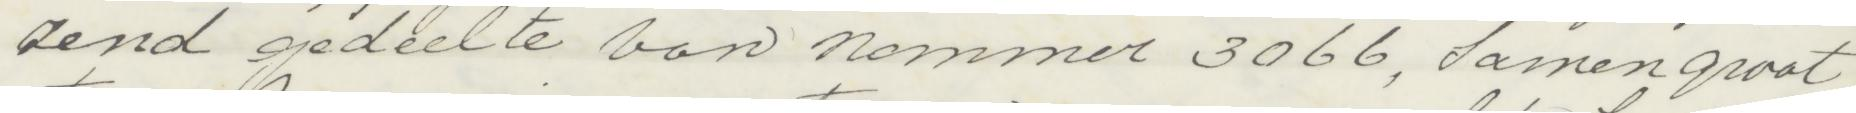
zend gedeelte van nommer 3066, samen groot
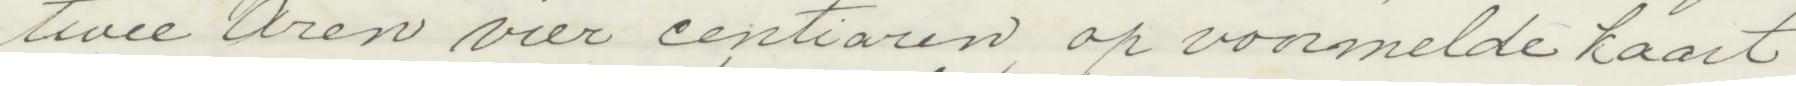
twee Aren vier centiaren, op voormelde kaart
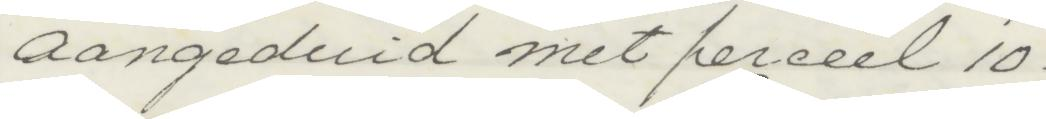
aangedeuid met perceel 10
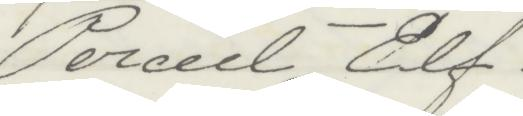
Perceel Elf
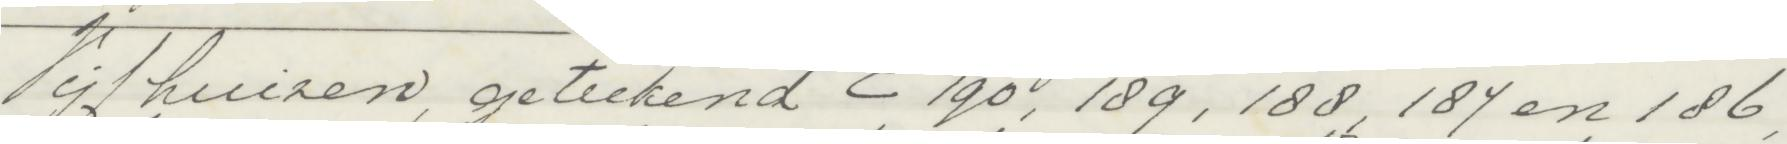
Vijf huizen, geteekend E 190, 189, 188, 187 en 186,
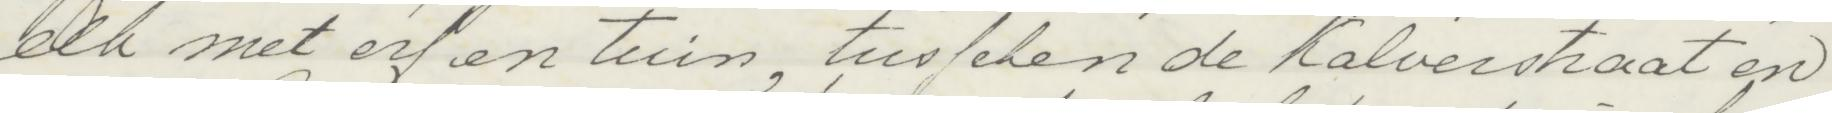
elk met erf en tuin, tusschen de Kalverstraat en
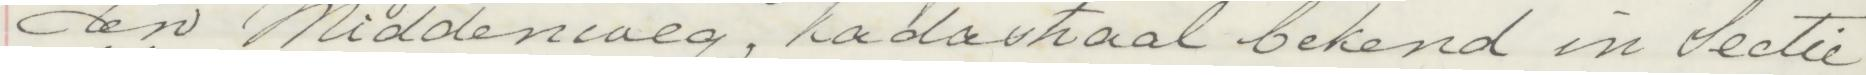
den Middenweg, kadastraal bekend in sectie
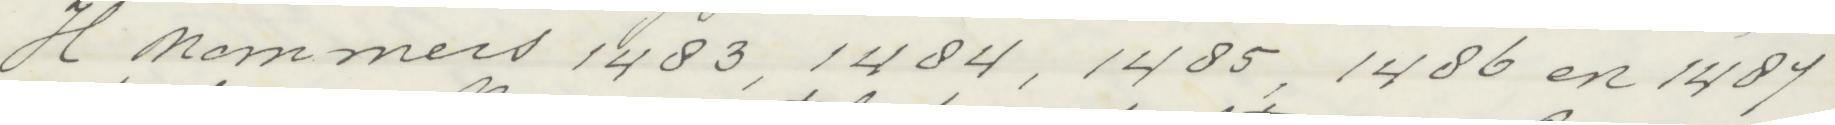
H Nommers 1483, 1484, 1485, 1486 en 1487
